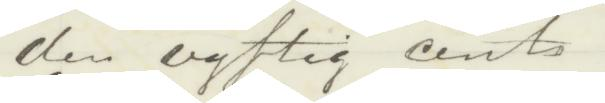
den vyftig cents
